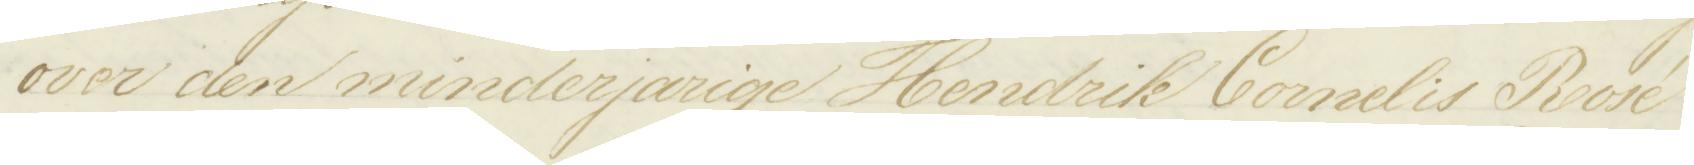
over den minderjarige Hendrik Cornelis Rosé
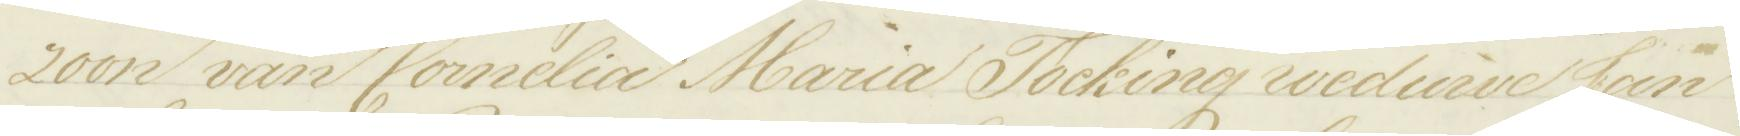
zoon van Cornelia Maria Focking weduwe Jan
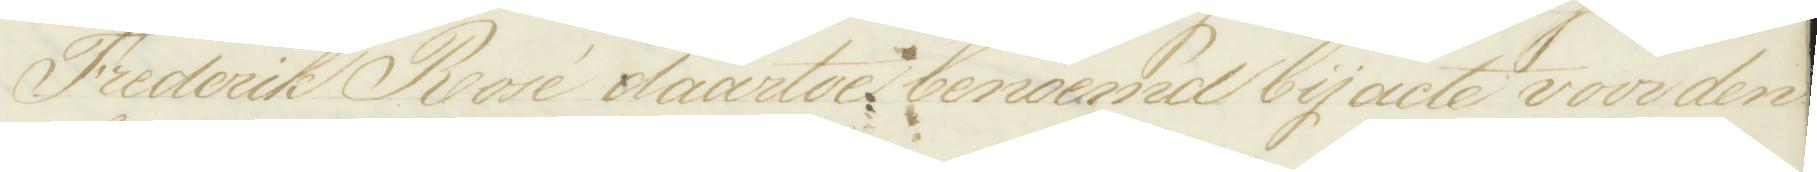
Frederik Rosé daartoe benoemd bij acte voor den
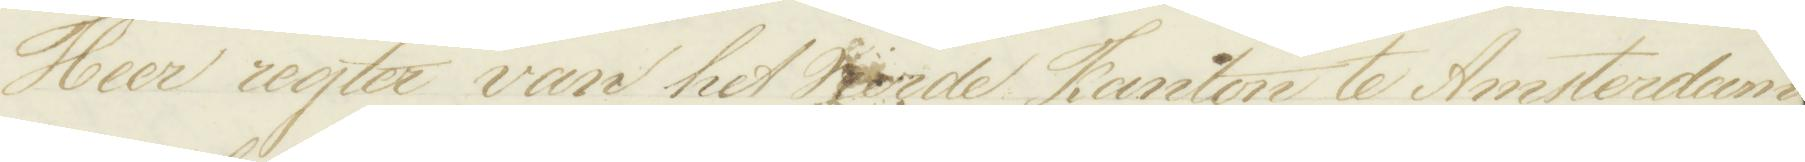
Heer regter van het Vierde Kanton te Amsterdam
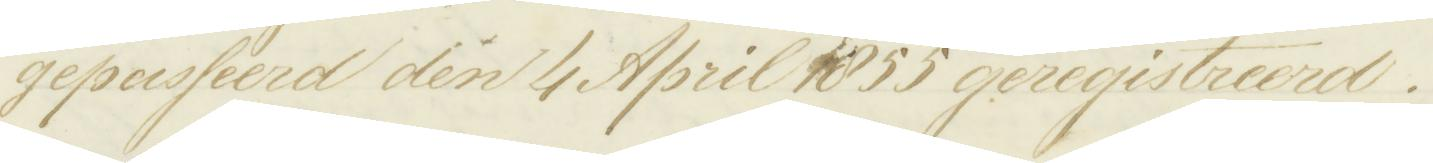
gepasseerd den 4 April 1855 geregistreerd.
